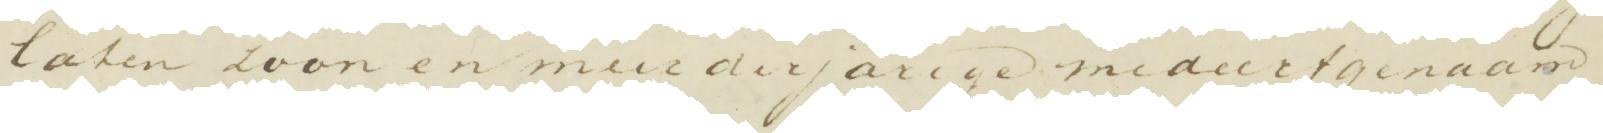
=laten zoon en meerderjarige medeerfgenaam
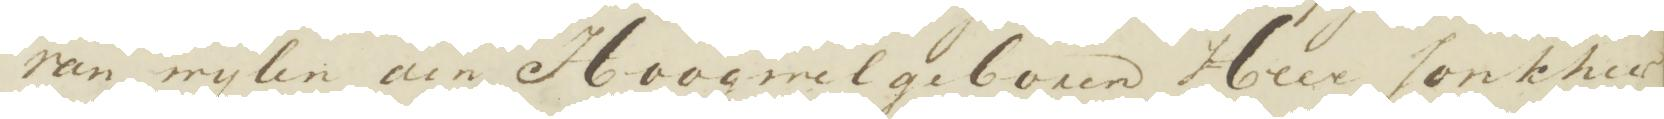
van wylen den Hoogwelgeboren Heer Jonkheer
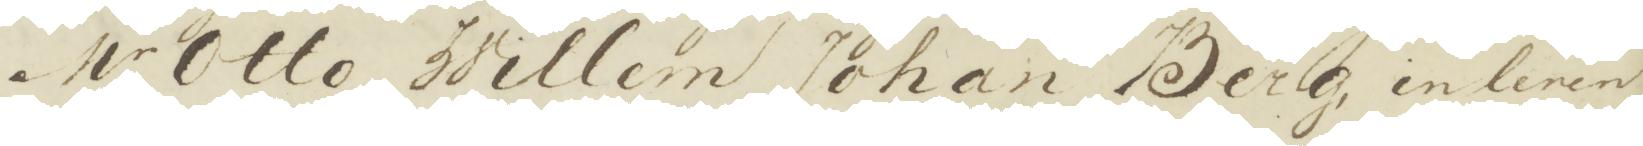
M.r Otto Willem Johan Berg, in leven
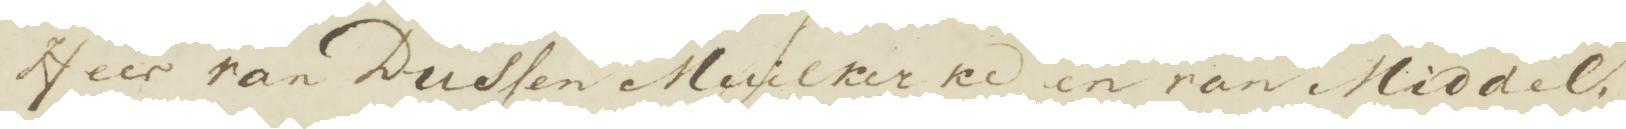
Heer van Dussen Muilkerke en van Middel,
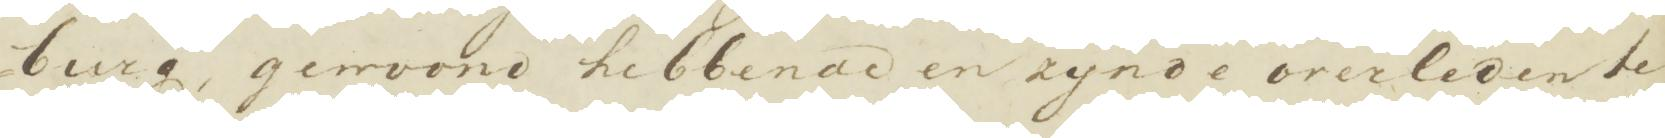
=burg, gewoond hebbende en zynde overleden te
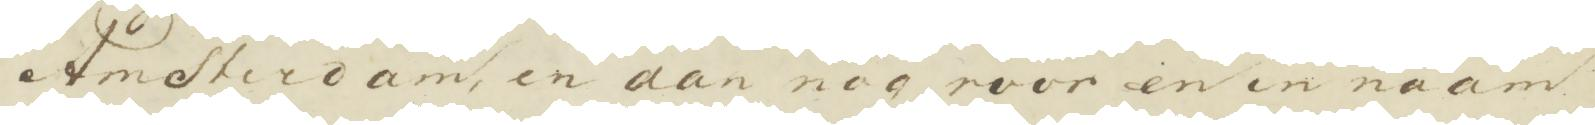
Amsterdam, en dan nog voor en in naam
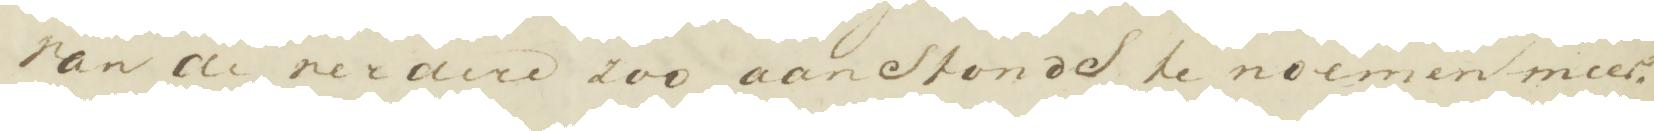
van de verdere zoo aanstonds te noemen meer„
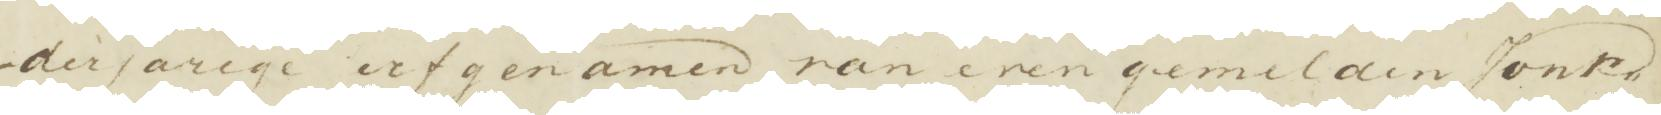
–derjarige erfgenamen van even gemelden Jonk
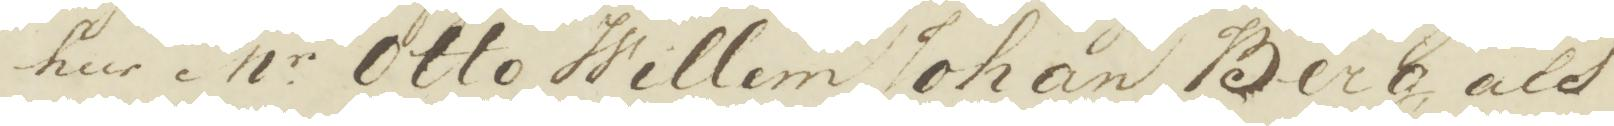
heer M.r Otto Willem Johan Berg, als
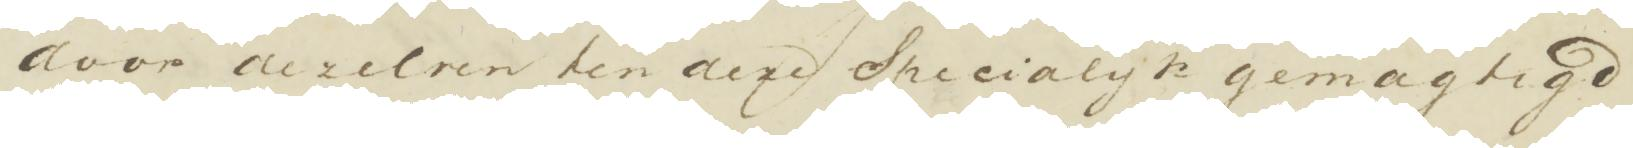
door dezelven ten deze specialyk gemagtigd
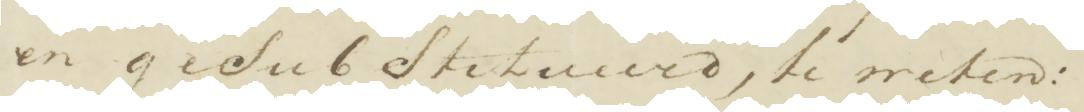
en gesubstitueerd, te weten:
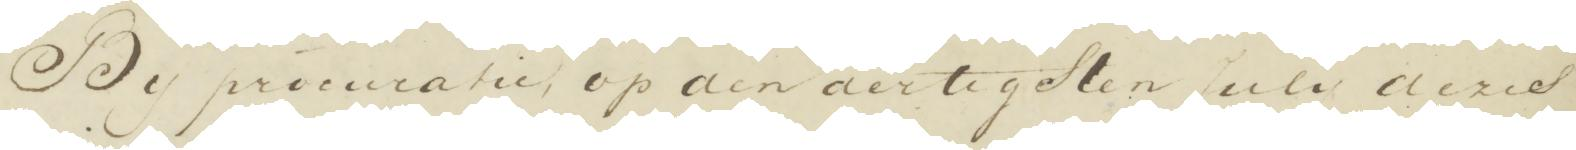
By procuratie, op den dertigsten July dezes
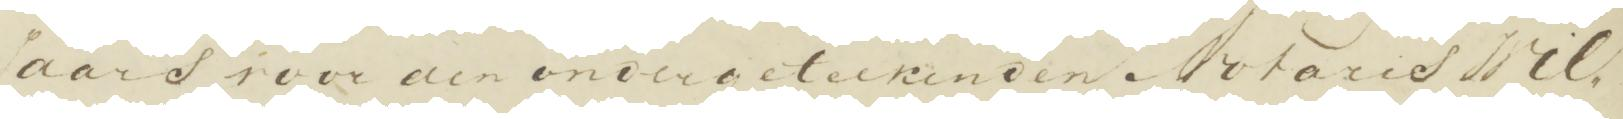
Jaars voor den ondergeteekenden Notaris Wil„
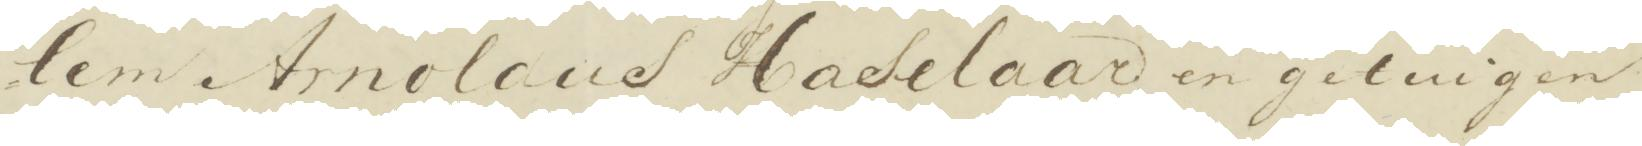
=lem Arnoldus Haselaar en getuigen.
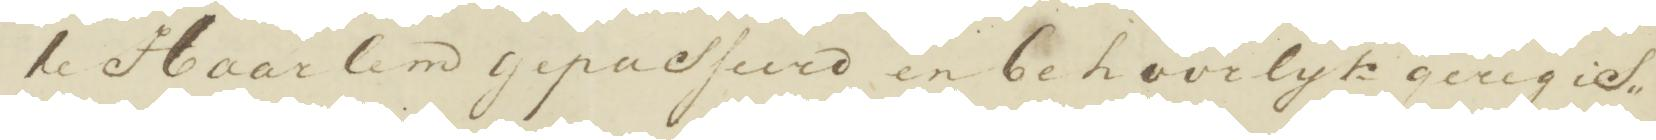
te Haarlem gepasseerd en behoorlyk geregis„
